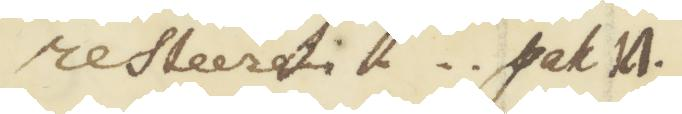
resteert . . . pak 14.
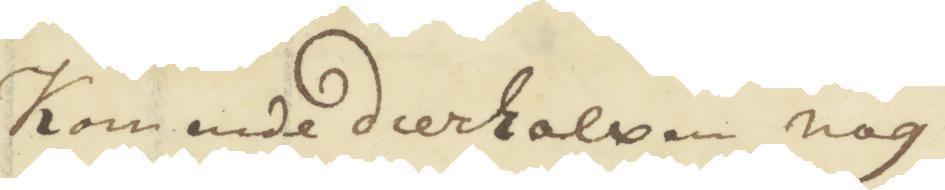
Komende dierhalven nog
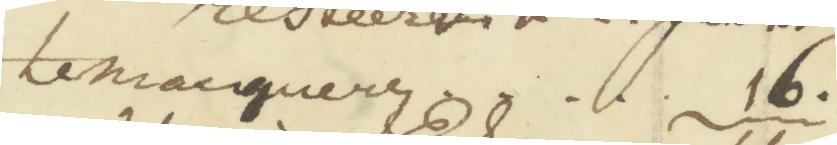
te macqueren . . . . . 16
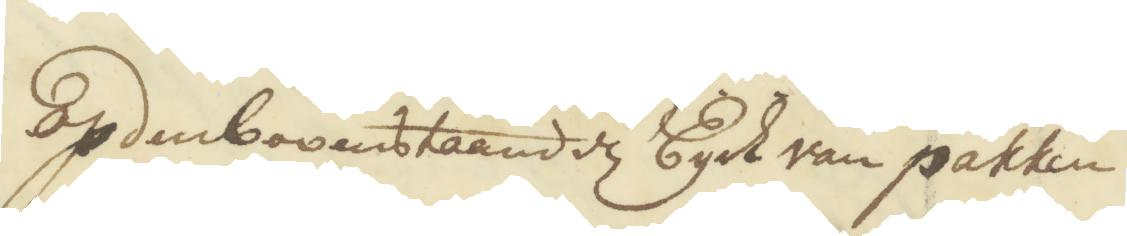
op den bovenstaanden Eysch van pakken
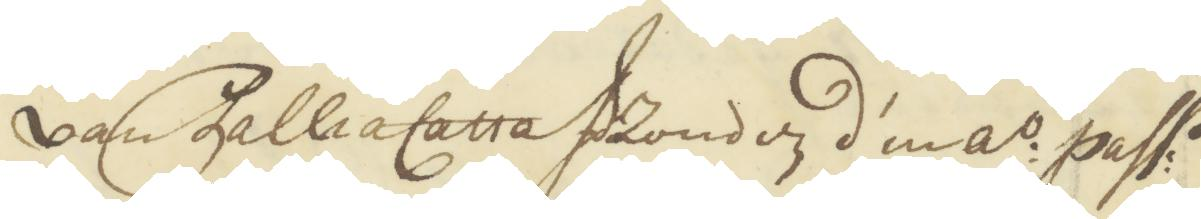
van Palliacatta verzonden d'in a:o pass:o
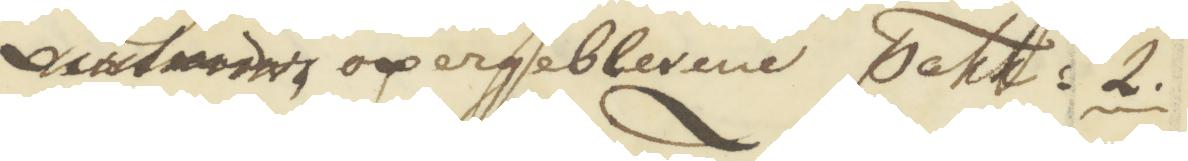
versonden overgeblevene pakk: 2.
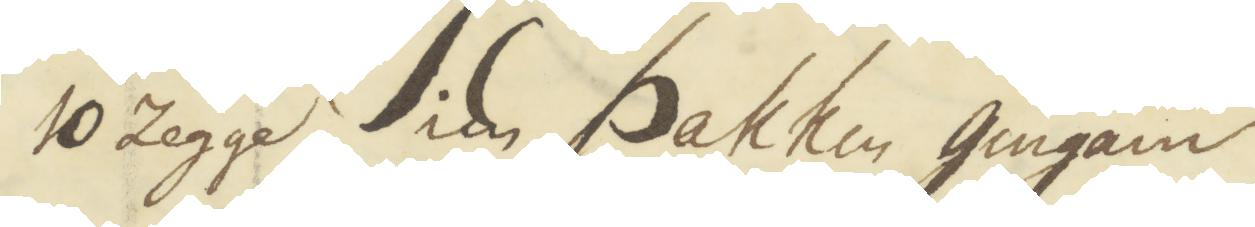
10 zegge Tien pakken gingam
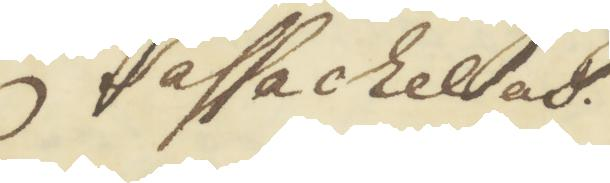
Tassachelas.
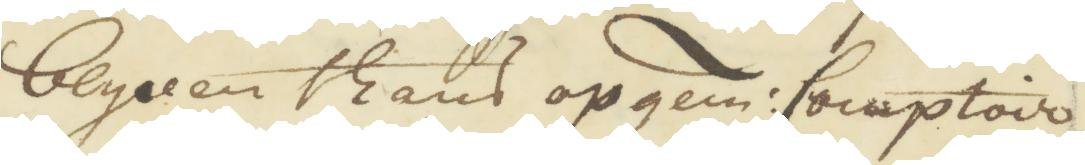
blyven thans op gem: Comptoir
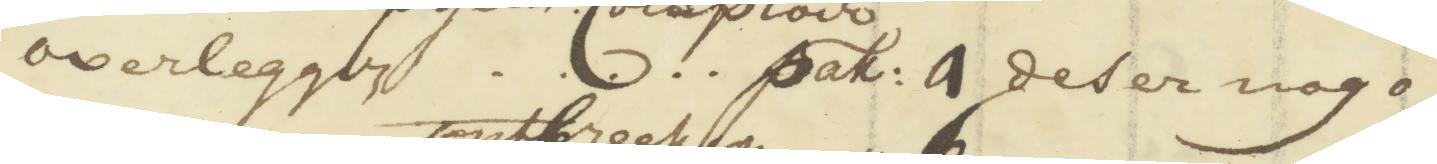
overleggen . . . . . pak: 4 deser nog o
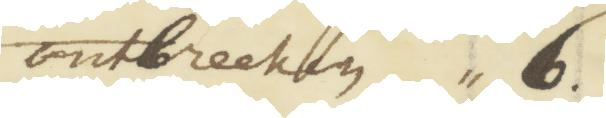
ontbreeken „ 6.
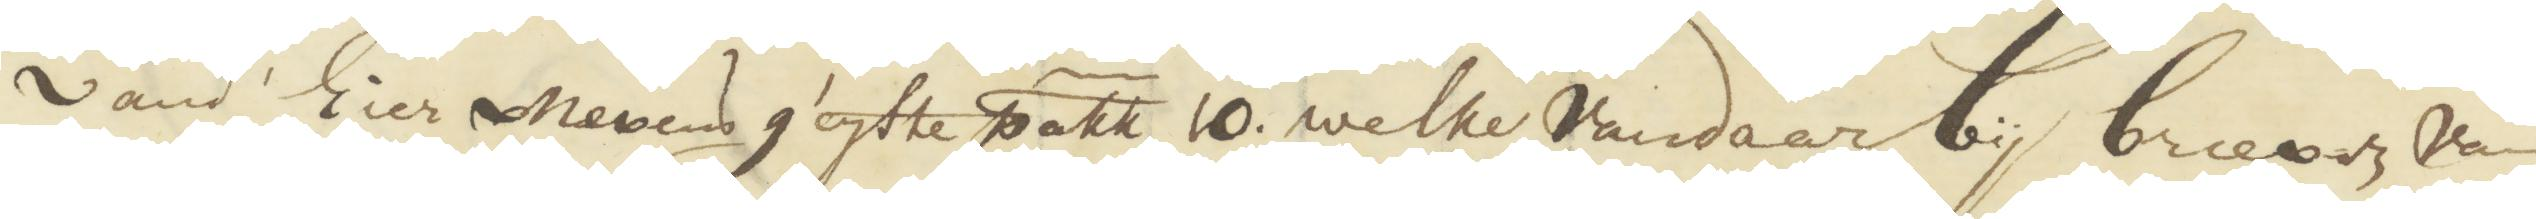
van d' hier vnevens g'eyste pakk 10. welke van daar bij brieven van
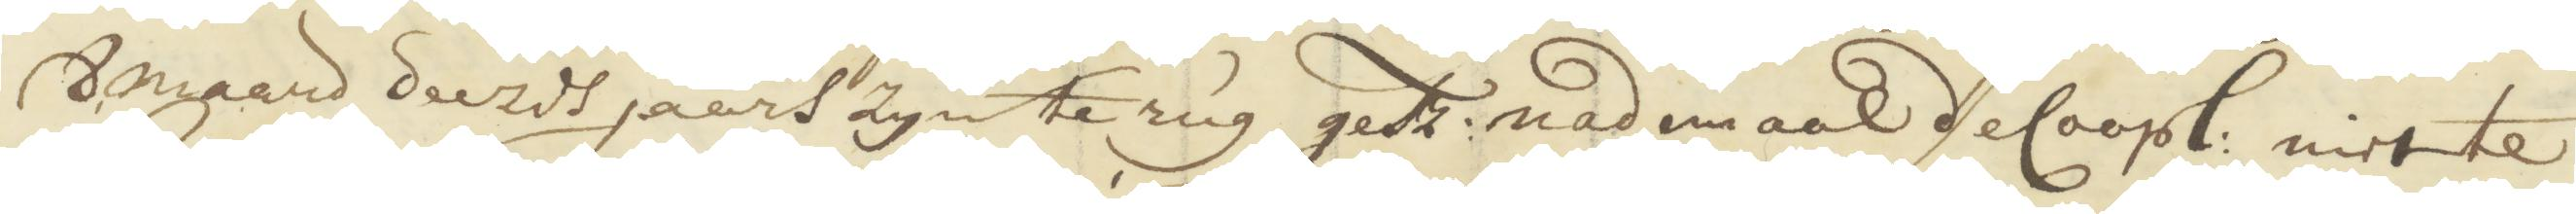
8 maard deezes jaars zyn te rug gesz: nademaal de coopl: niet te
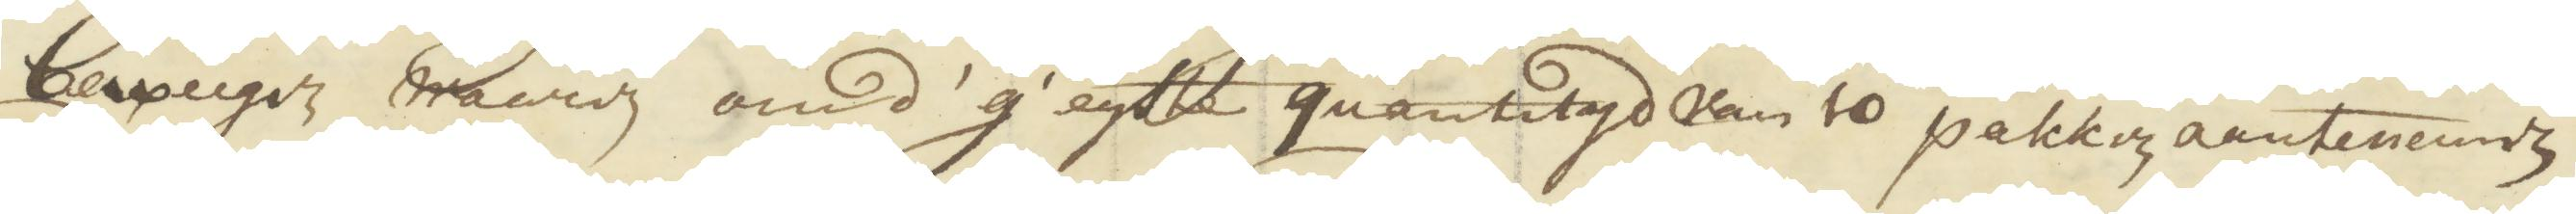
beweegen waaren om d' g'eyste quantityd van 10 pakken aantenemen
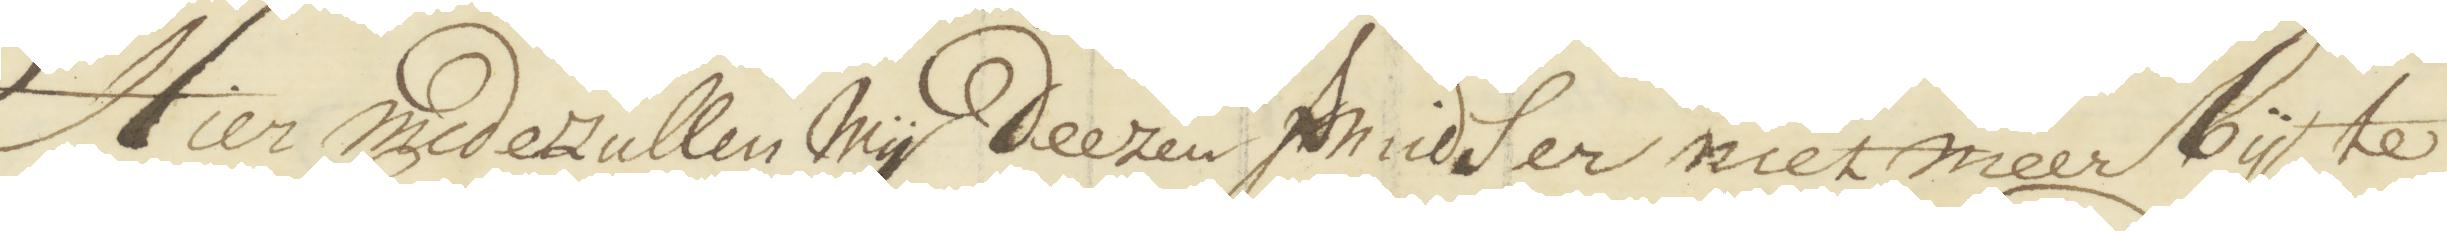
Hier medezullen wij deezen vermids er niet meer bij te
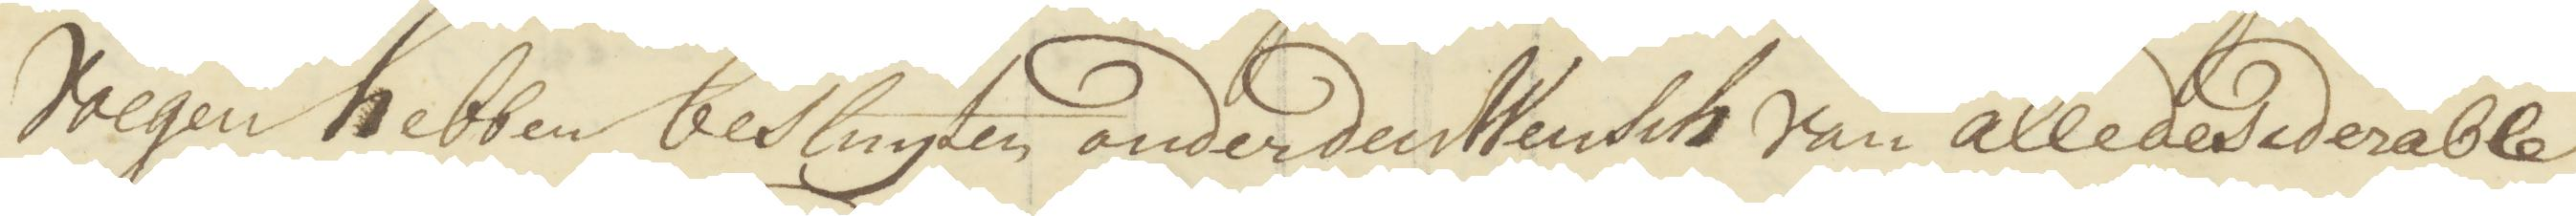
voegen hebben besluijten onder den Wensch van alle desiderable
